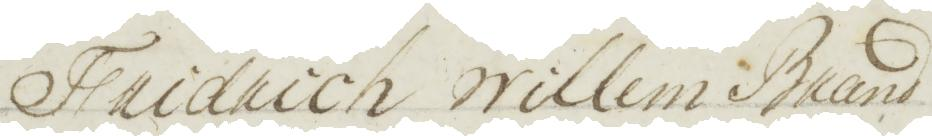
Fridrich Willem Brand
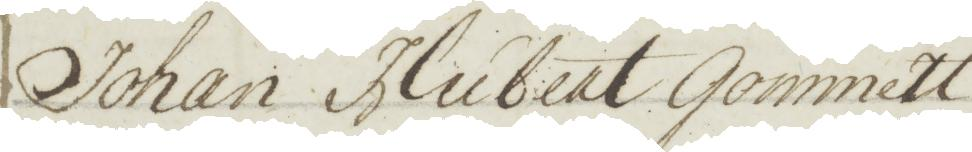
Johan Hubert Gommert
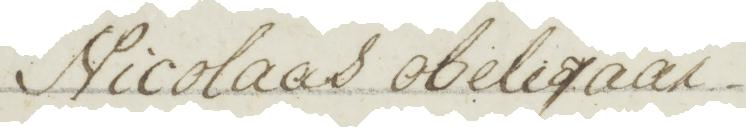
Nicolaas obelijaar -
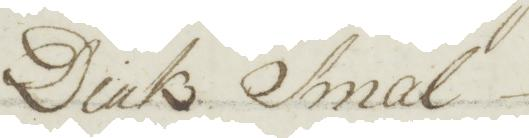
Dirk Smal -
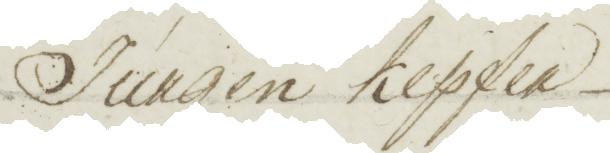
Jurgen kepfer -
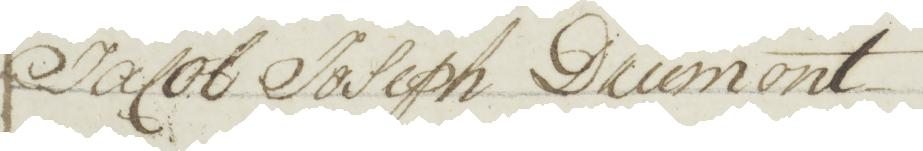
Iacob Ioseph Drumont
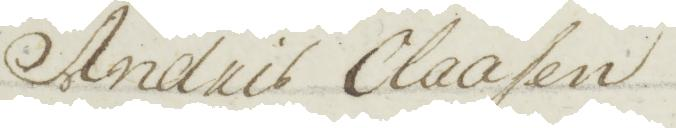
Andris Claasen
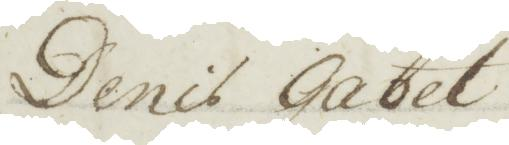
Denis Gabet
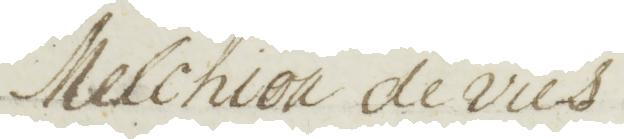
Melchior de vies
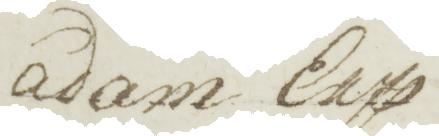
adam Erp
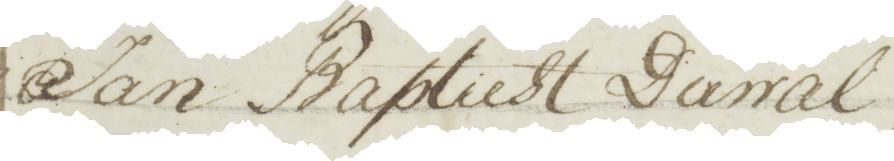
Ian Baptiest Duwal
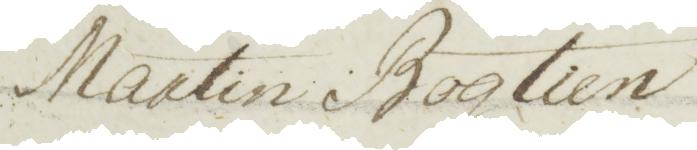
Martin Bogtien
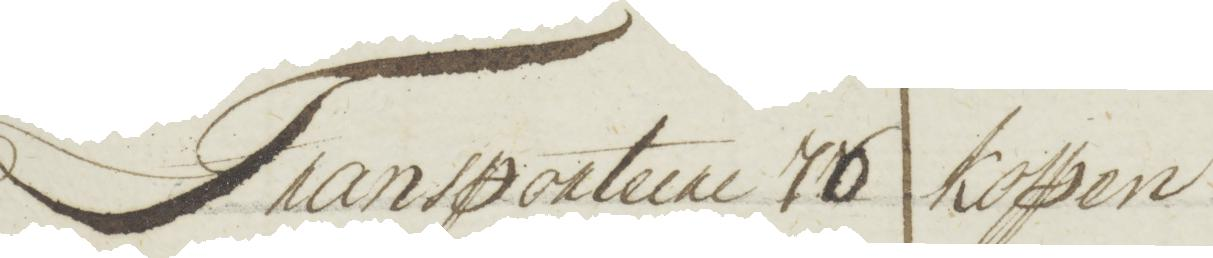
Transporteere 76 koppen
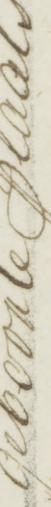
geboorte plaats
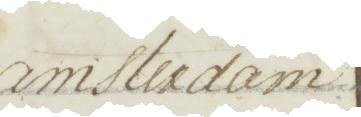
amsterdam.
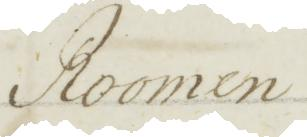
Roomen
